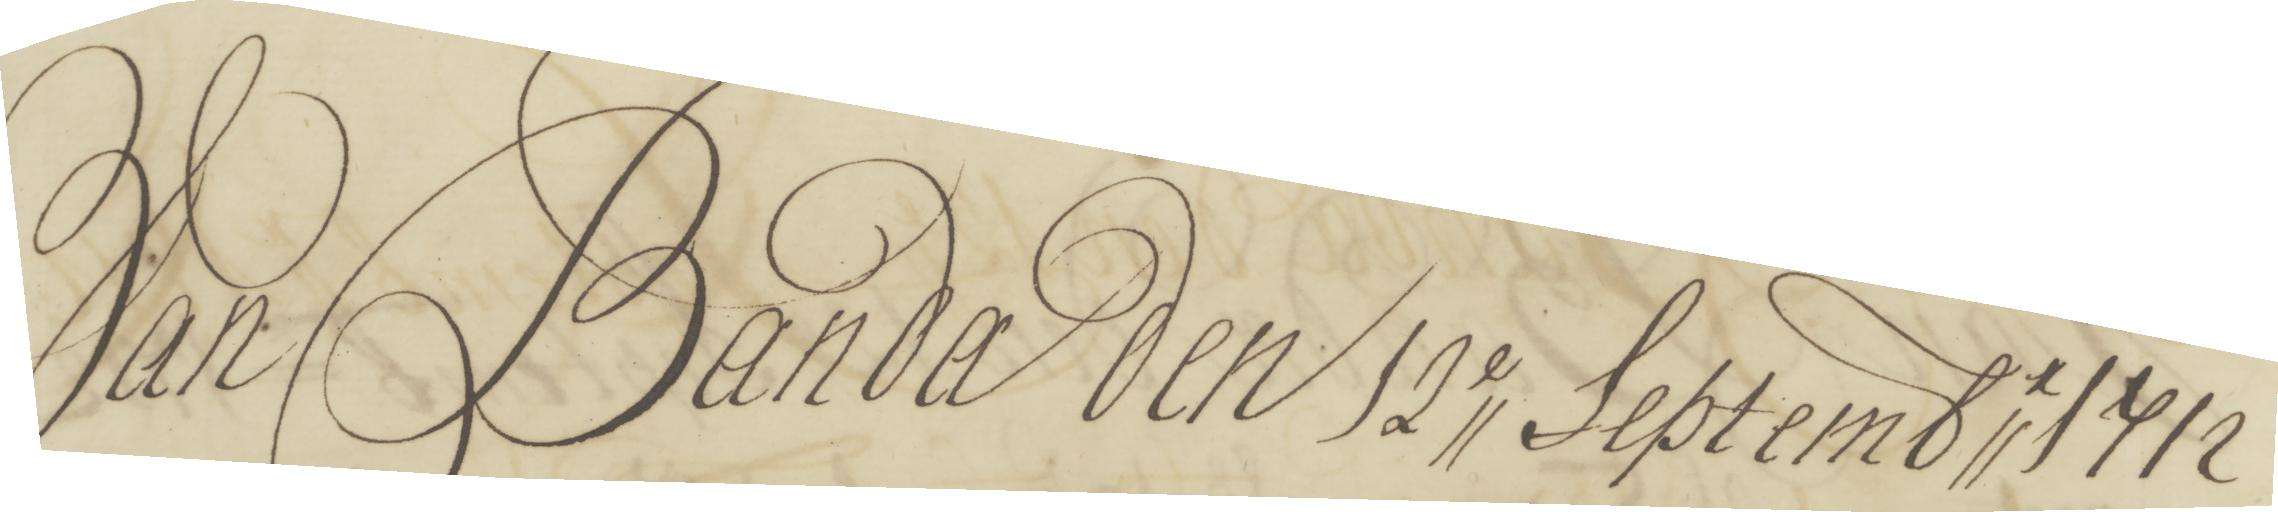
Van Banda den 12„e Septemb„r 1712
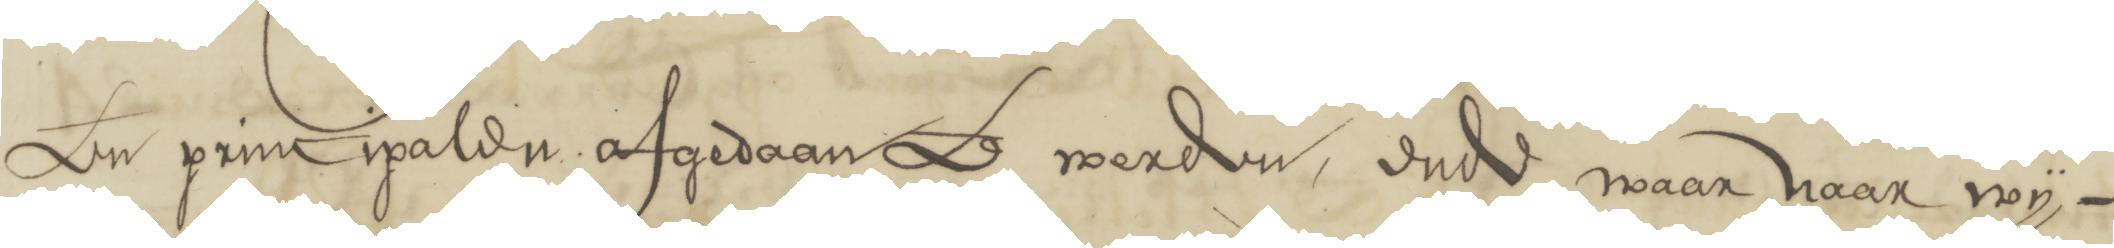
ten principalen afgedaan te werden, ende waar naar wij
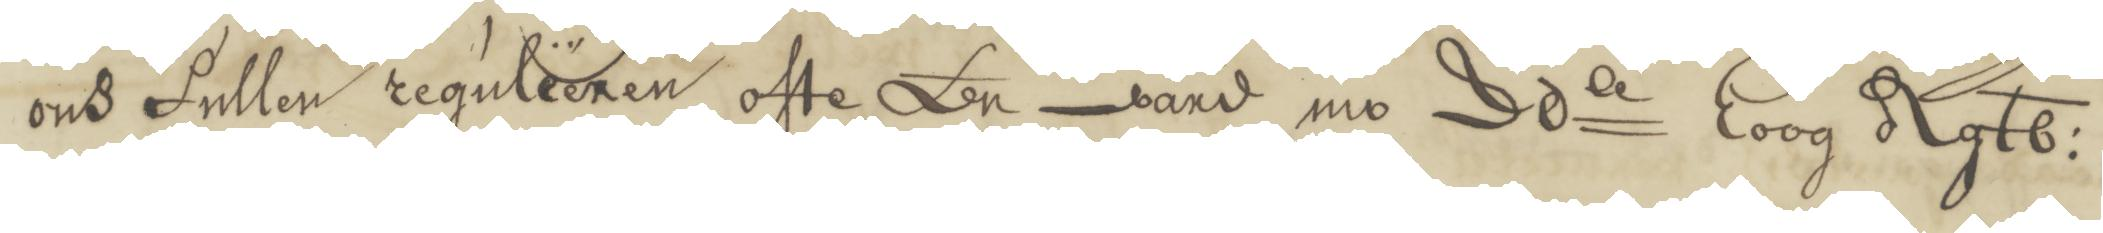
ons sullen reguleeren ofte ten ware uw Ed=le hoog Agtb:
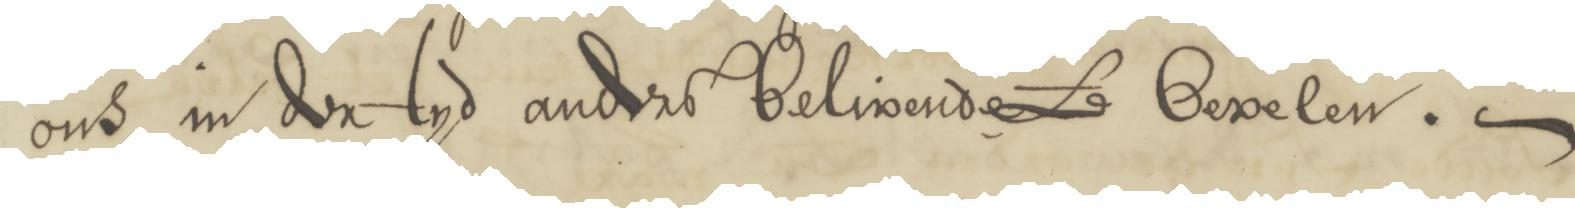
ons in der tyd anders belivende te bevelen. —
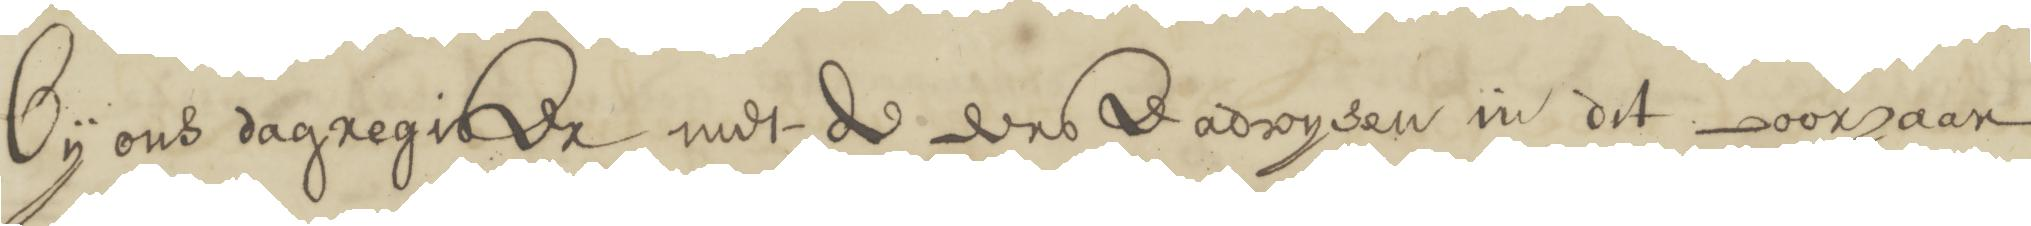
bij ons dag register met de eerste advysen in dit voorjaar
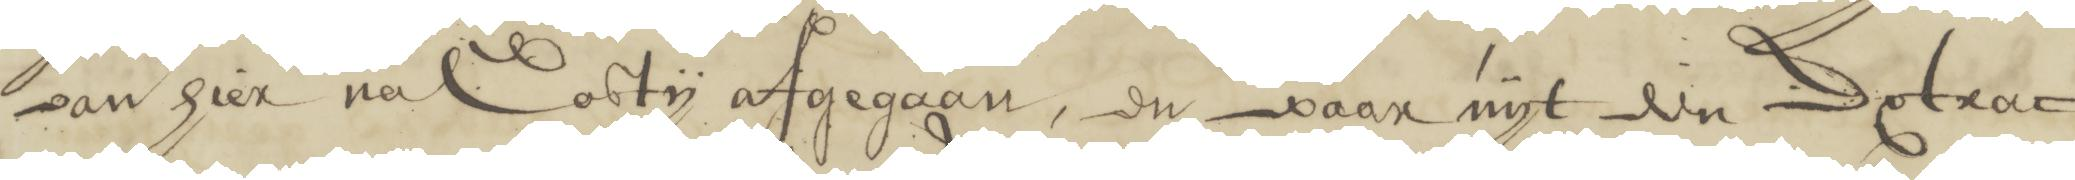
van hier na Costij afgegaan, en waar uijt een Extract
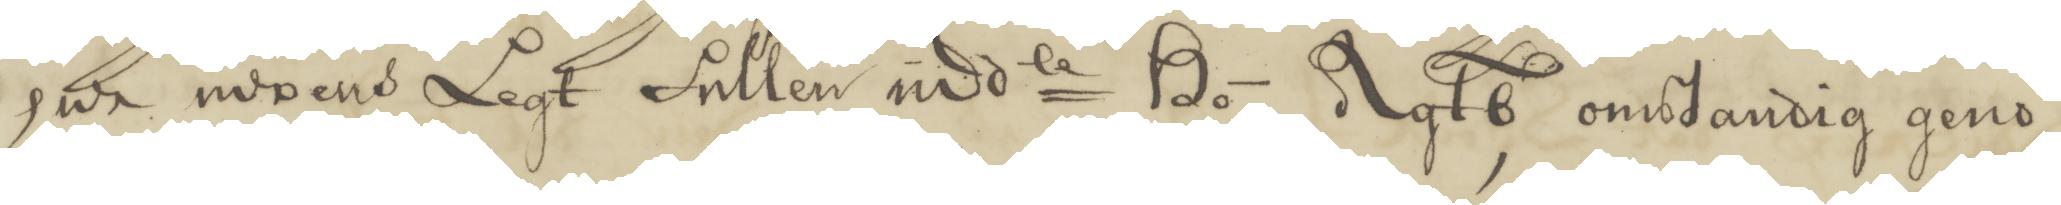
hier nevens Legt sullen uEd=le Ho Agtb omstandig geno
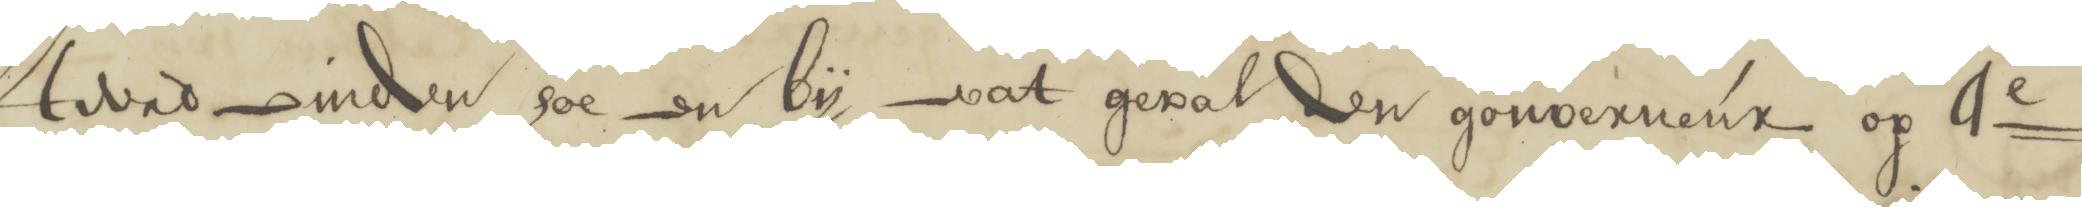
„teerd vinden hoe en bij wat geval den gouverneur op 4=e
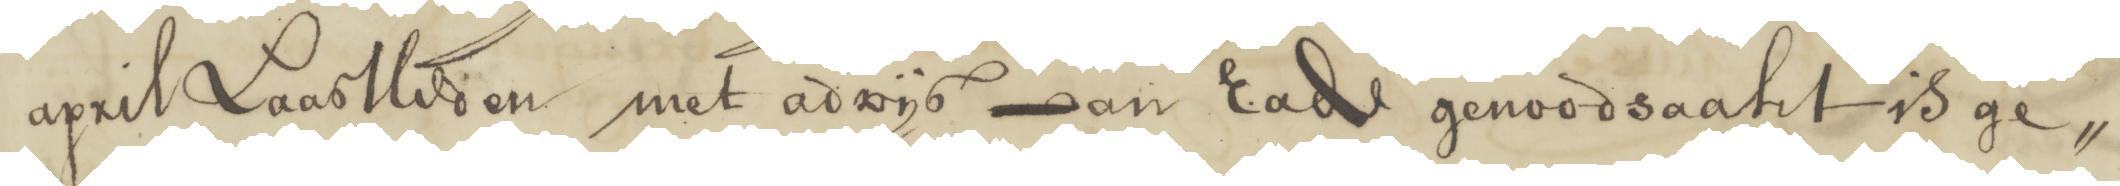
april Laastleden met advijs van rade genoodsaakt is ge„
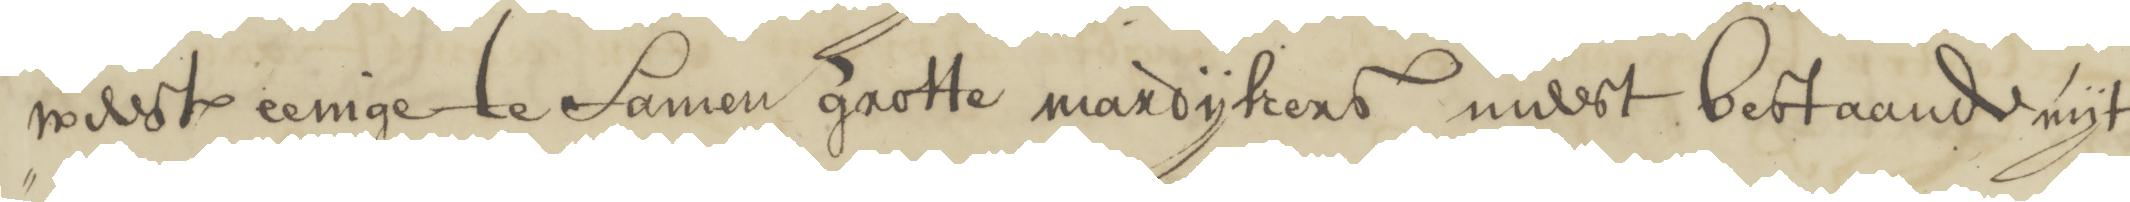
„weest eenige te samen grotte mardijkers meest bestaande uijt
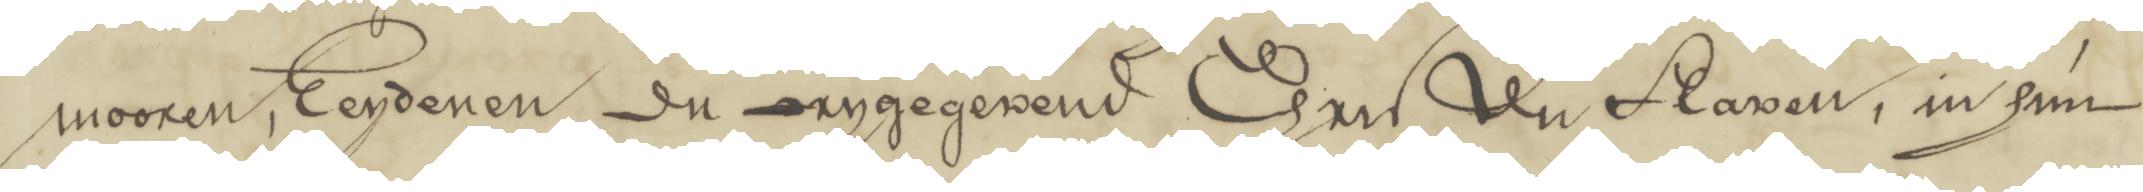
mooren, heydenen en vrygegevend Christen slaven, in hun
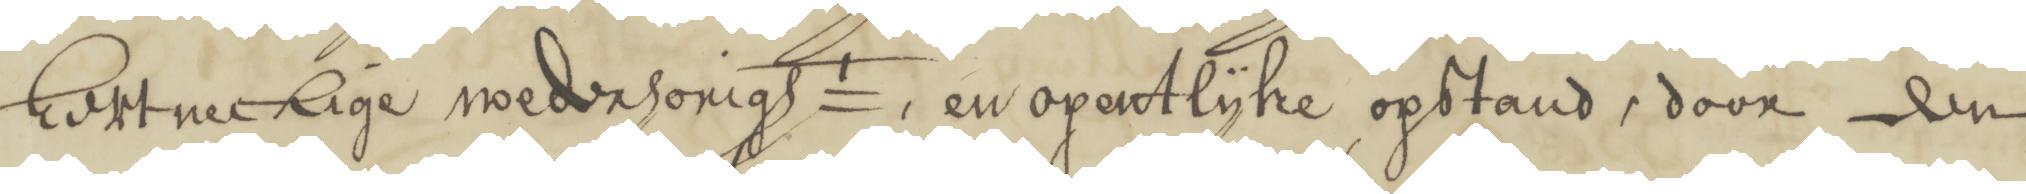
hertneckige wederhorigh=t, en opentlijke opstand, door een
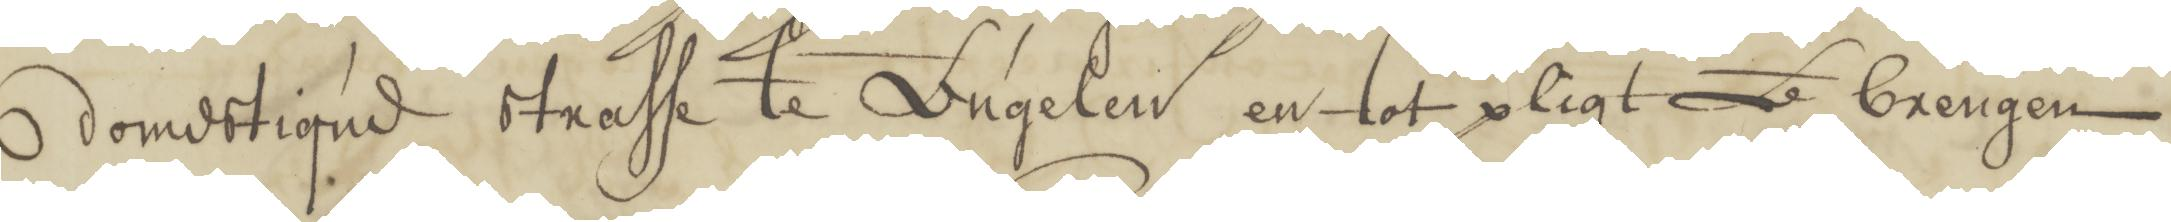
domestique straffe te teugelen en tot pligt te brengen
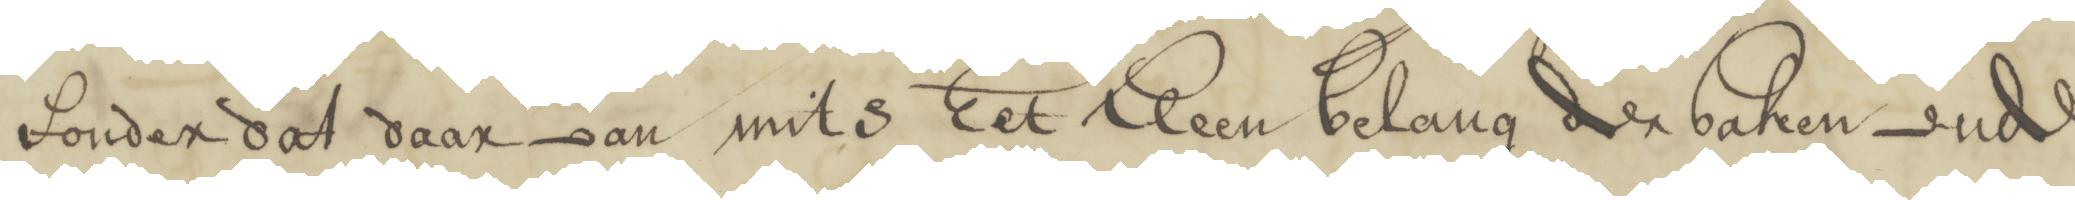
sonder dat daar van mits het kleen belang der baken ende
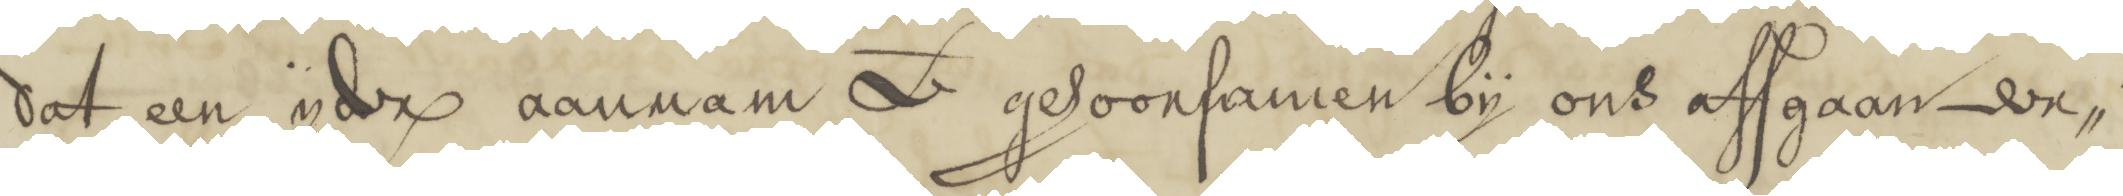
dat een ijder aannam te gehoorsamen bij ons affgaan eer„
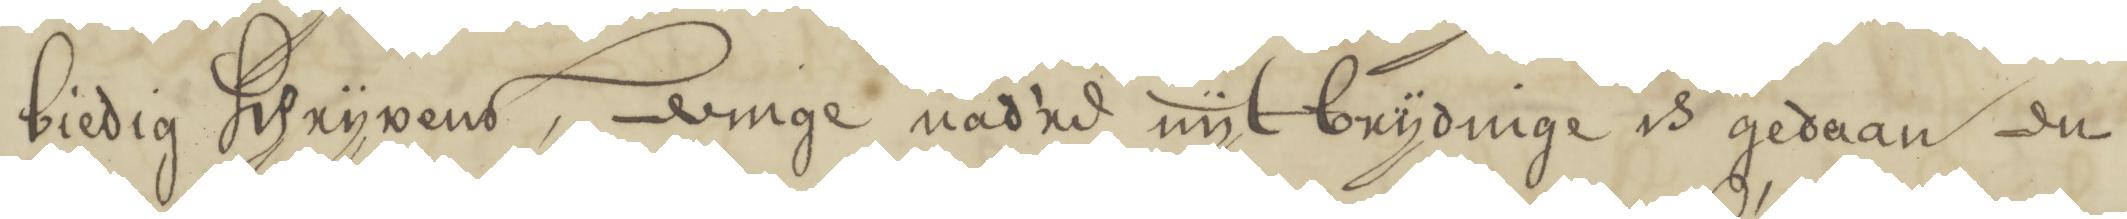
biedig schrijvens, eenige nad're uijt brijdinge is gedaan en
